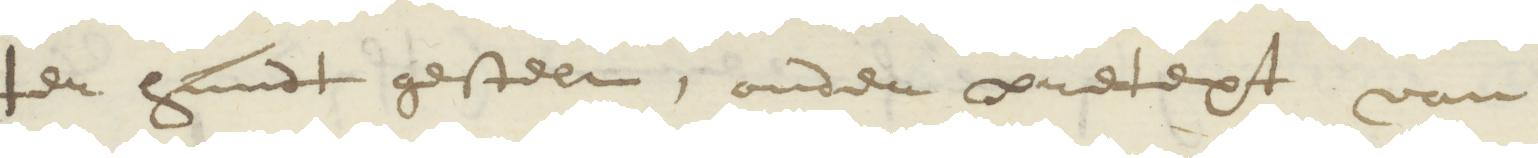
ter handt gestelt, onder pretext van
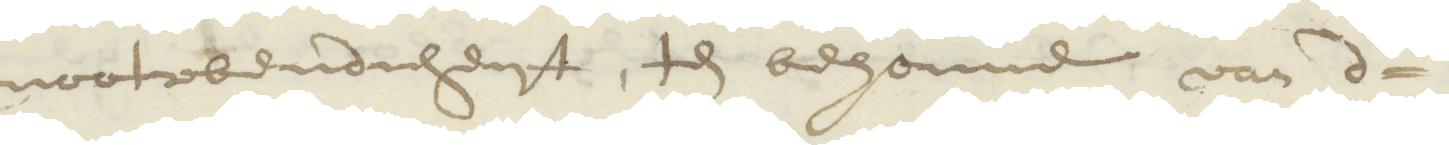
nootwendicheyt, ten behouve van d=o
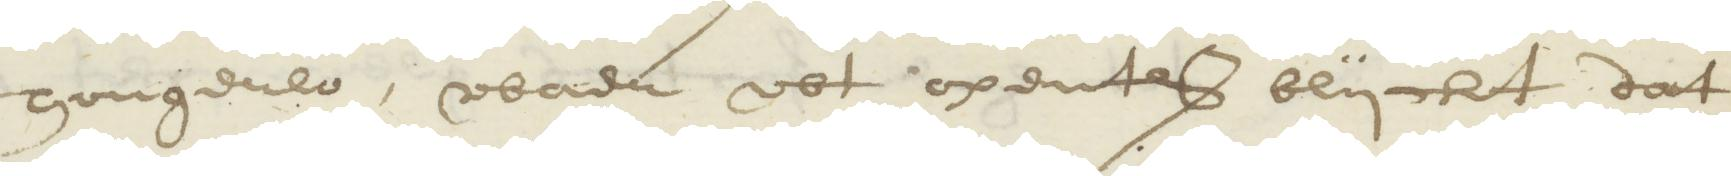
gongerlo, waer tot opentlijk blijckt dat
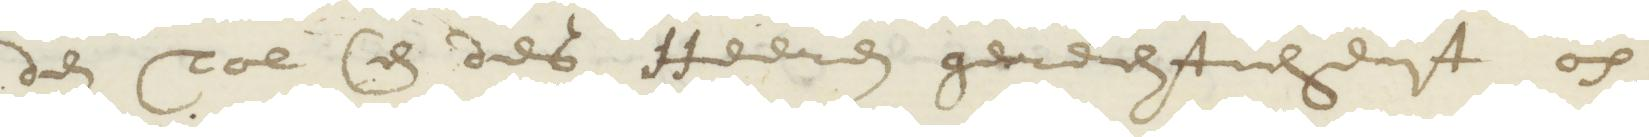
den toe ende des Heeren gerechticheijt op
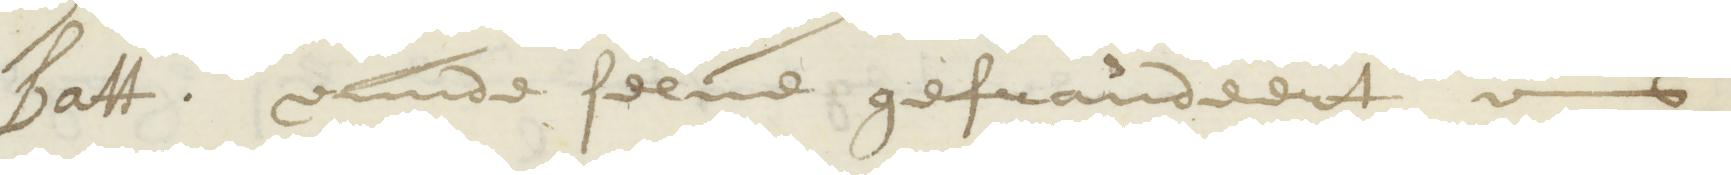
batt.a vande selve gefraudeert is,
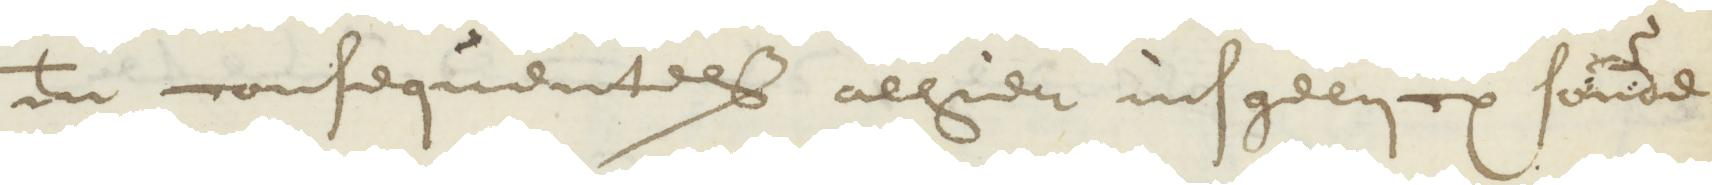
en consequentelijk alhier insgelycx soude
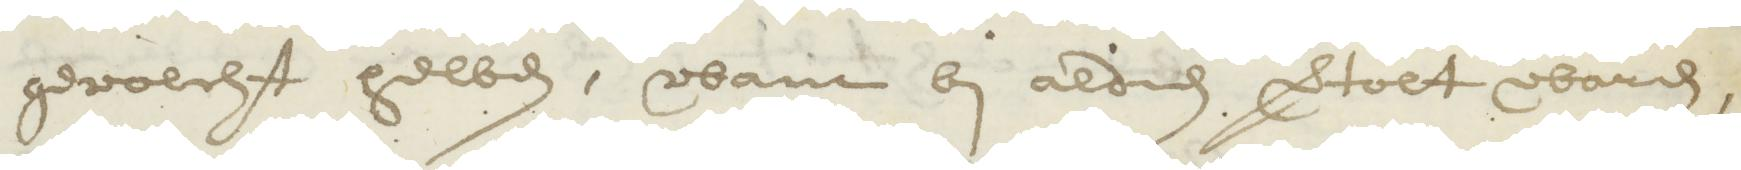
gevolcht hebben, want bj aldien vertolt waren,
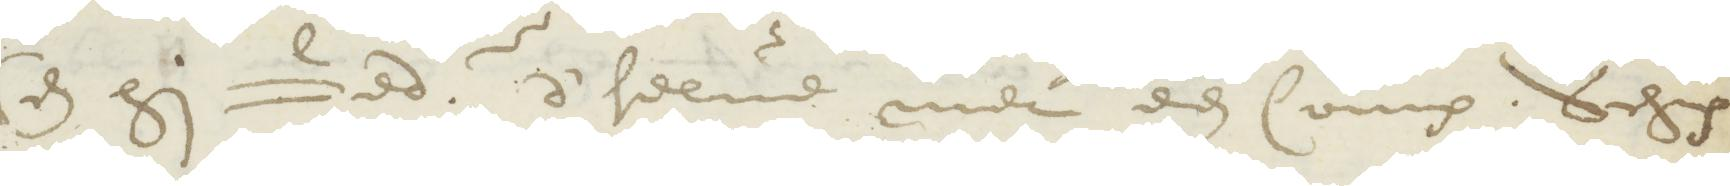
en hj Ged. d’selve met een Comp: schip
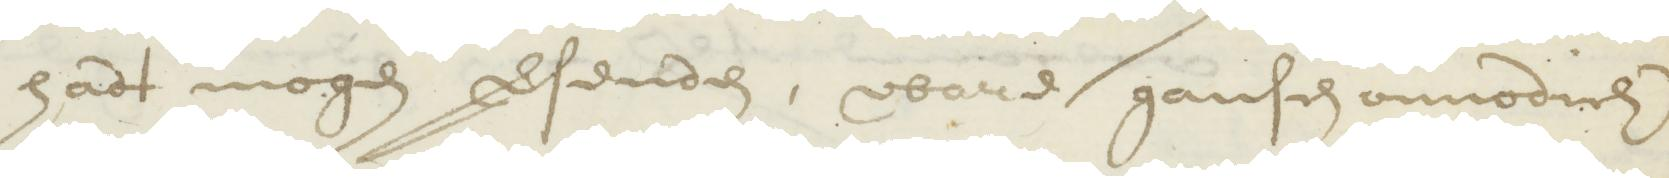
hadt mogen versenden, ware gansch onnodich
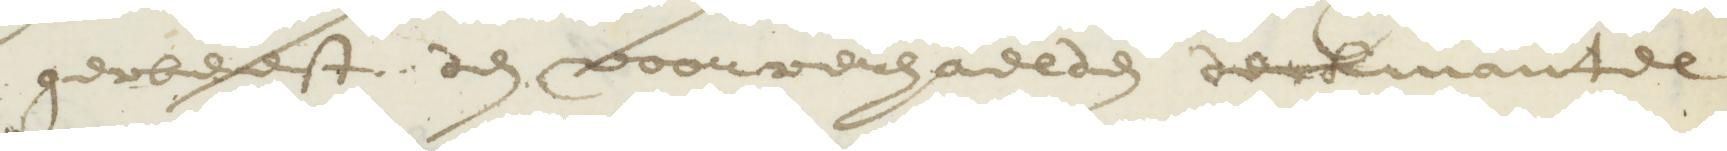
geweest den voorverhaelden deckmantel
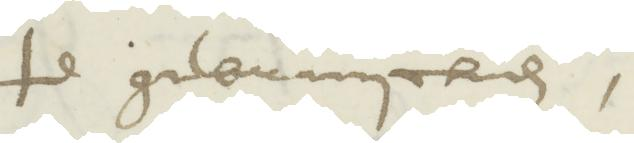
te gebruijcken,
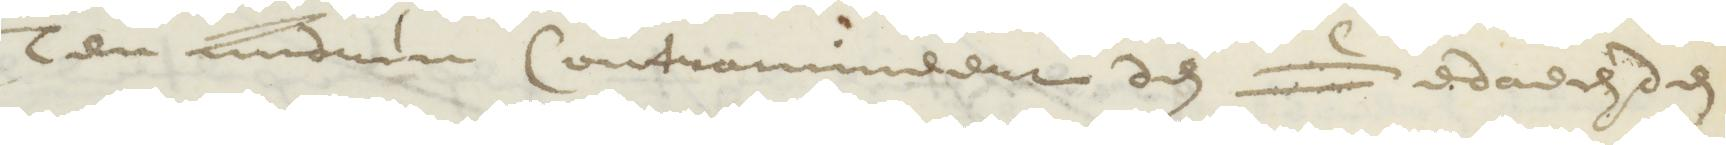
Ten anderen Contramineert den Gedaechden
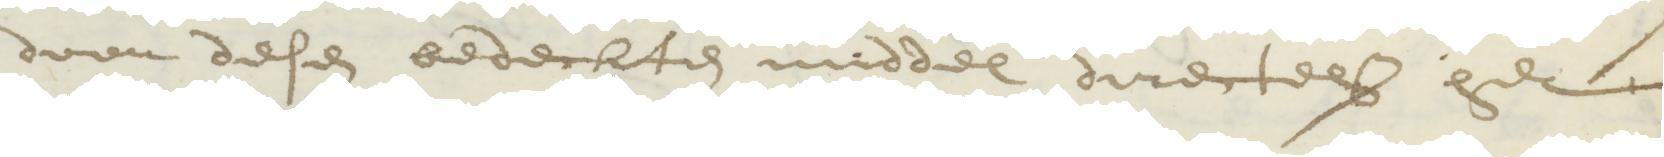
door desen bedeckten middel directelijk hes
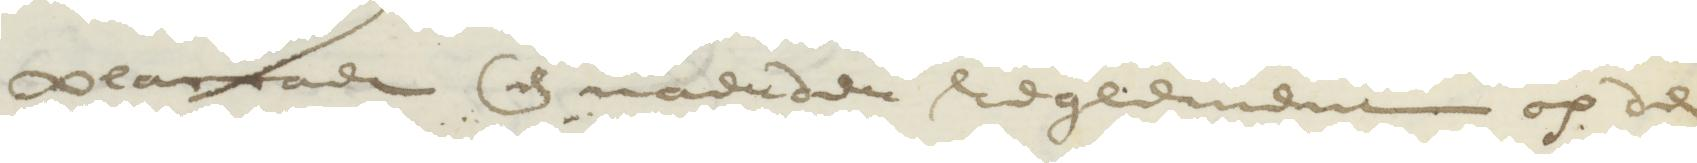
vlastaen ende naer der reglement op den
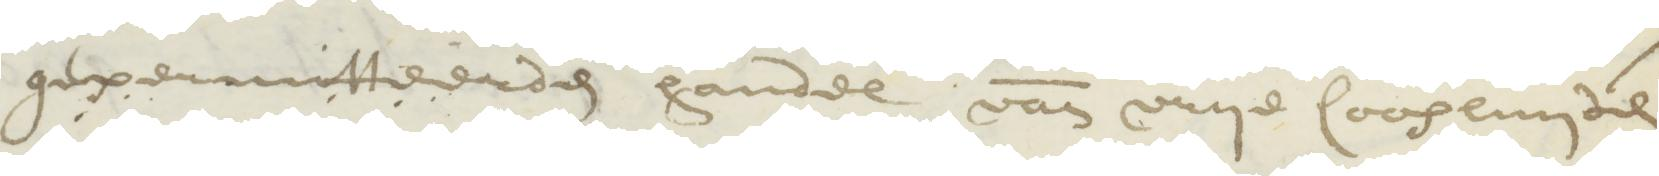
gepermitteerden handel van vrije Coopluyden
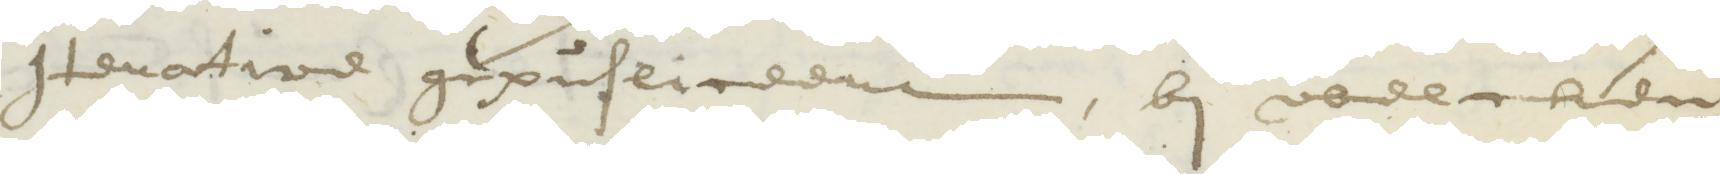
Jterative gepuflireert, by welcken
